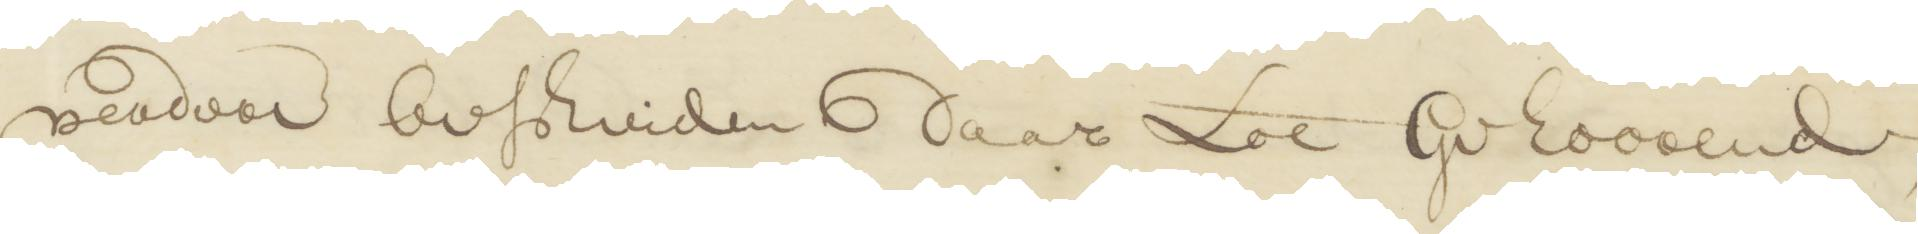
verdere bescheiden daar toe gehoorende,
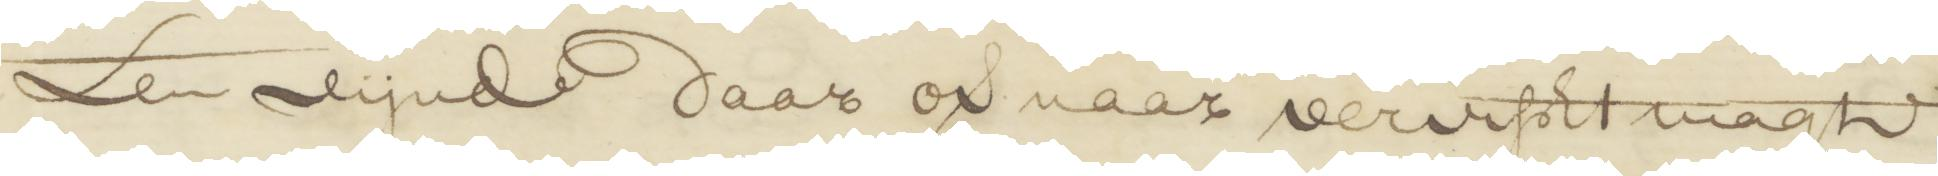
ten eijnde daar over naar vereischt magte
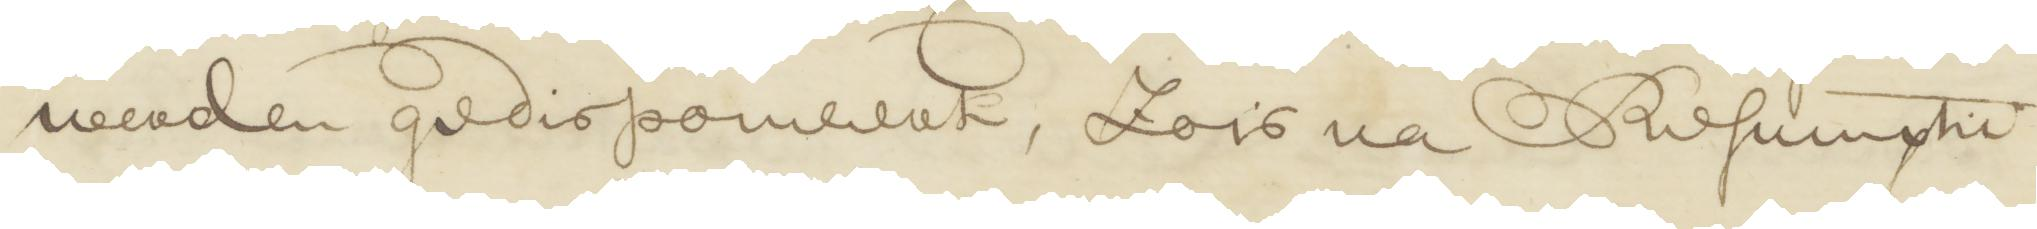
werden gedisponeert, zo is na Resumptie
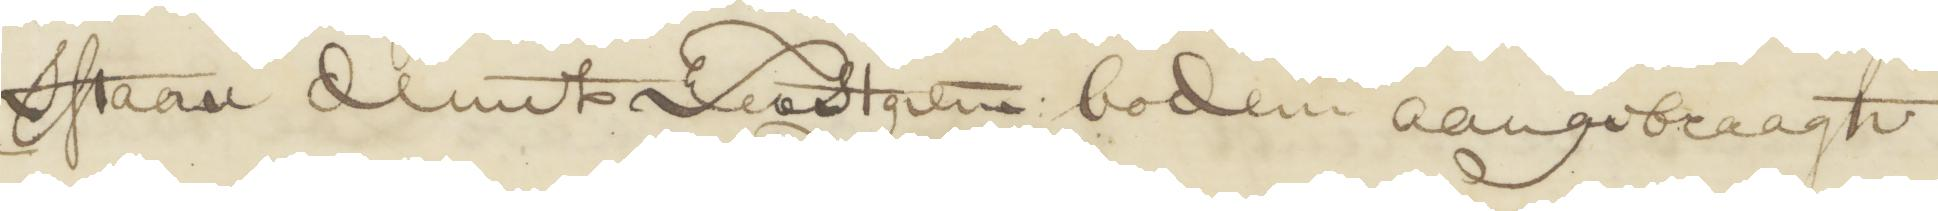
verstaan de met Eerstgem: bodem aangebraagte
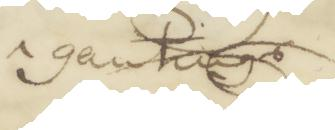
^ gantangs
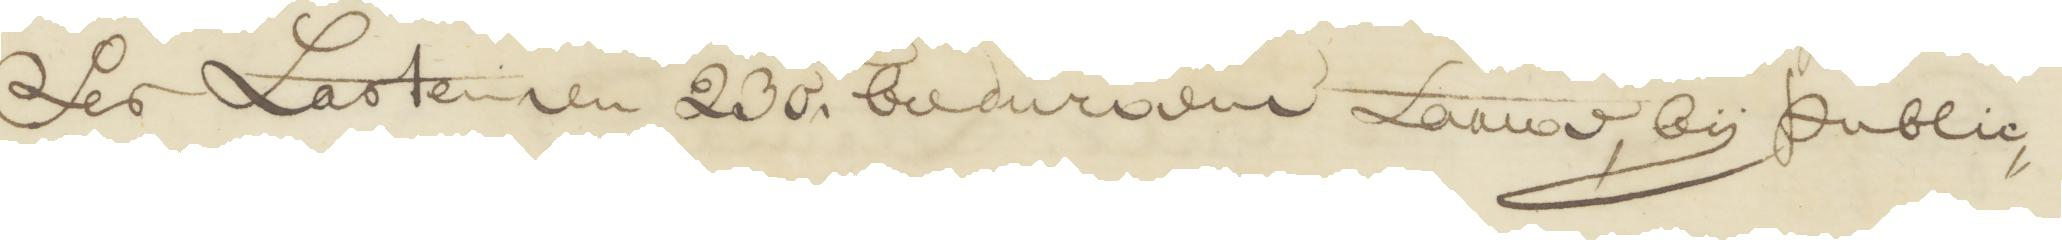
Ses Lasten en 230^ bedurven tarwe, bij public„
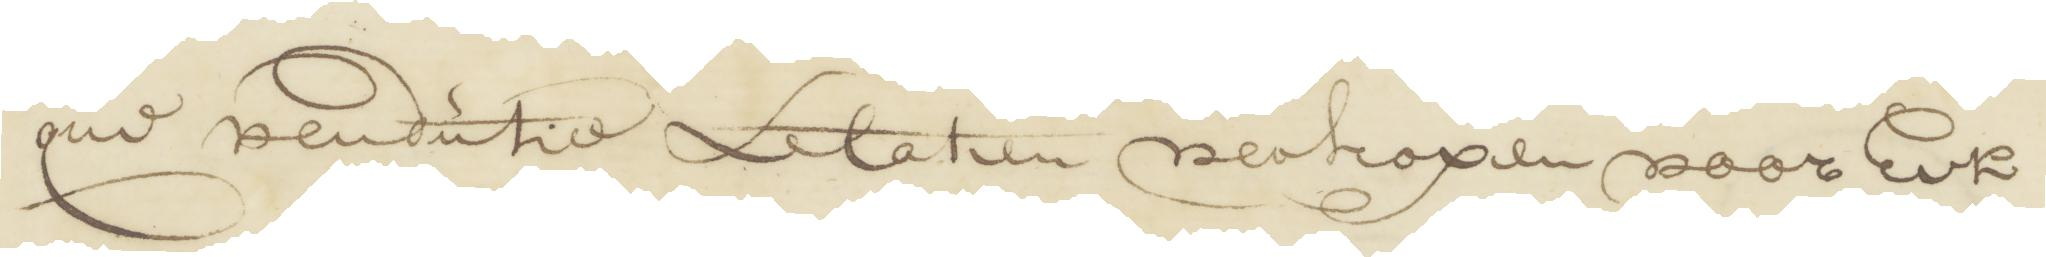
que vendutie telaten verkopen voor het
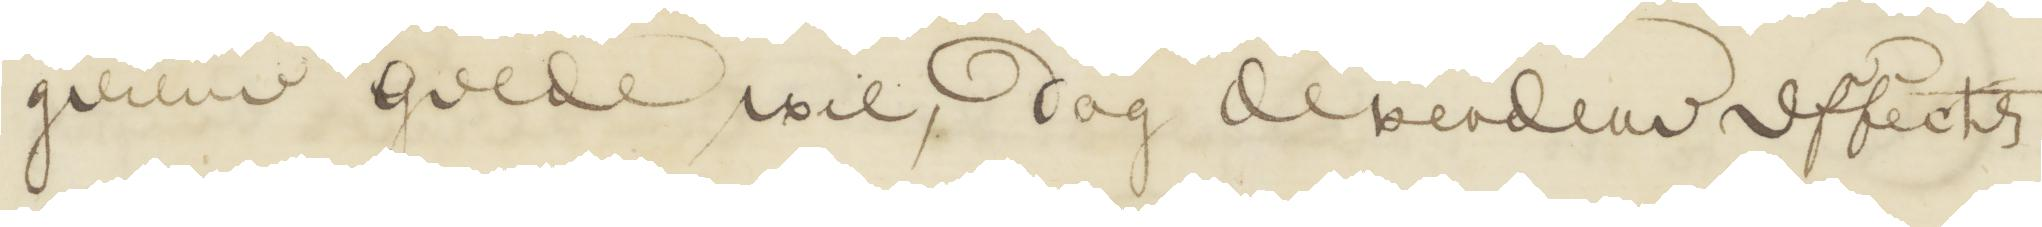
geene gelde wil, dog de verdere Effecten
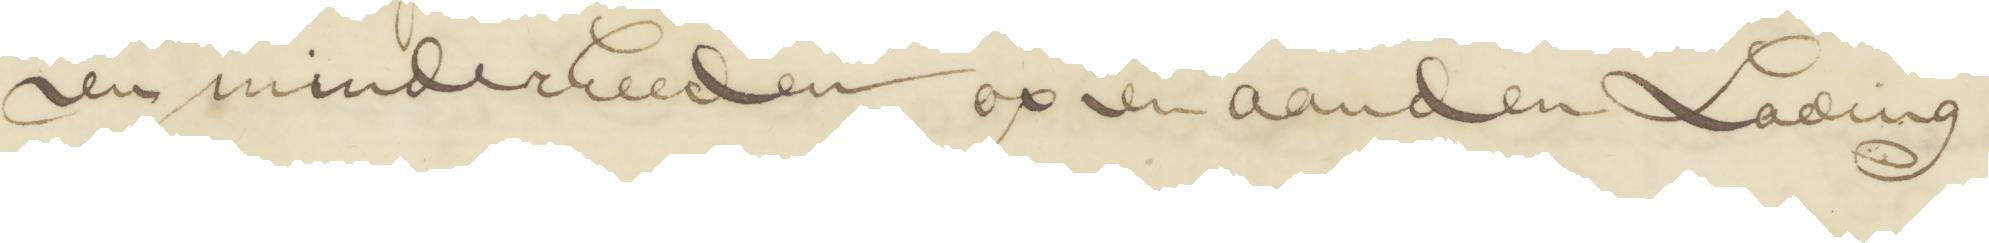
en minderheeden op en aan den Lading
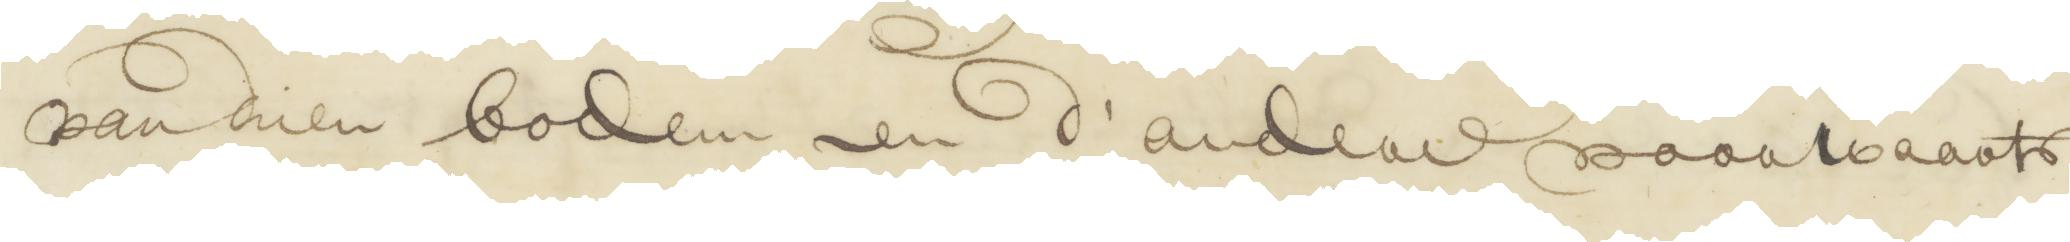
van dien bodem en d’ andere voorwaarts
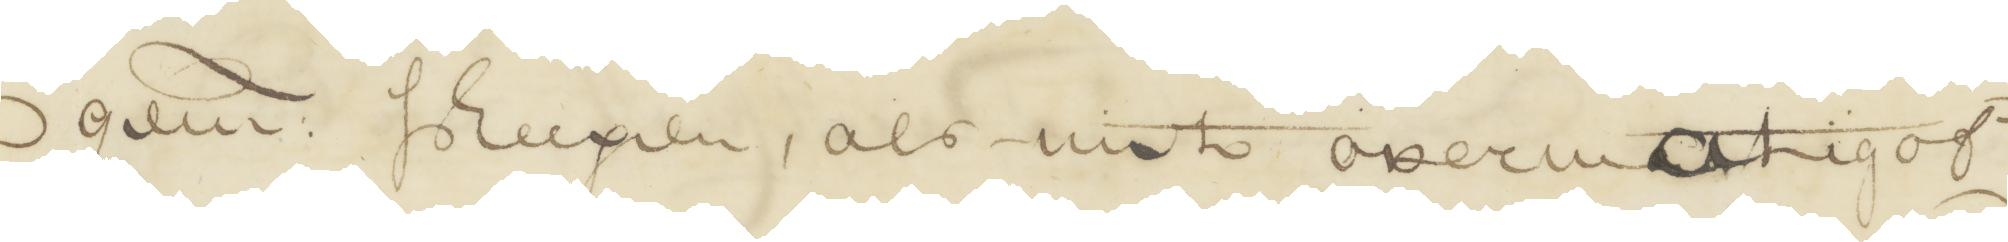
gem: scheepen, als niet overmatig of
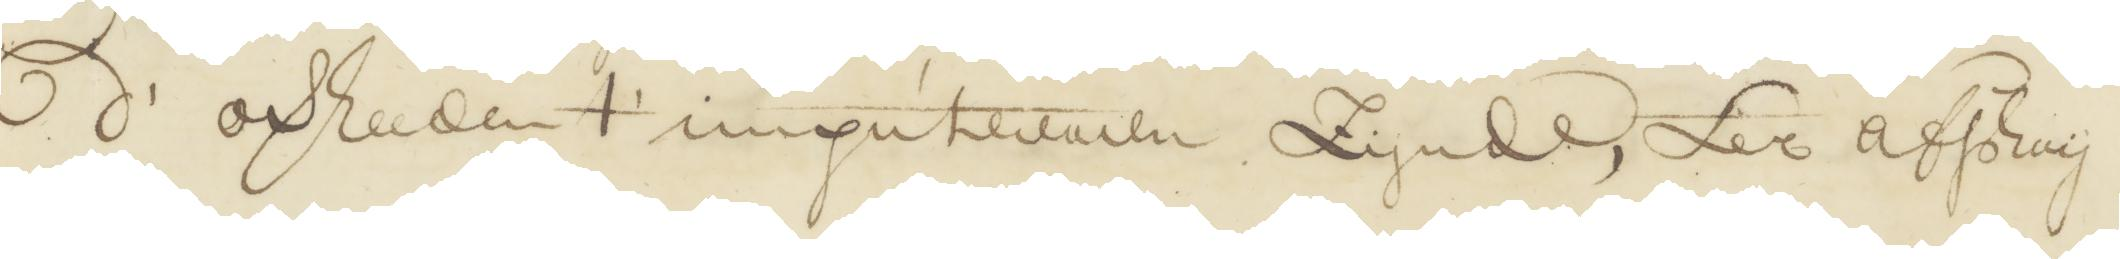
d’ overheden t’ imputeeren Zijnde, ter afschuij
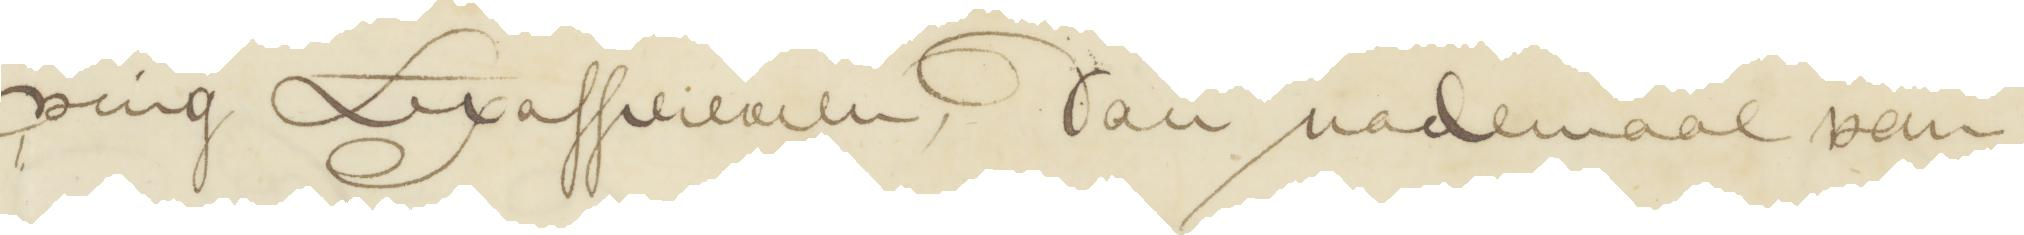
ving tepasseieren, dan nademaal van
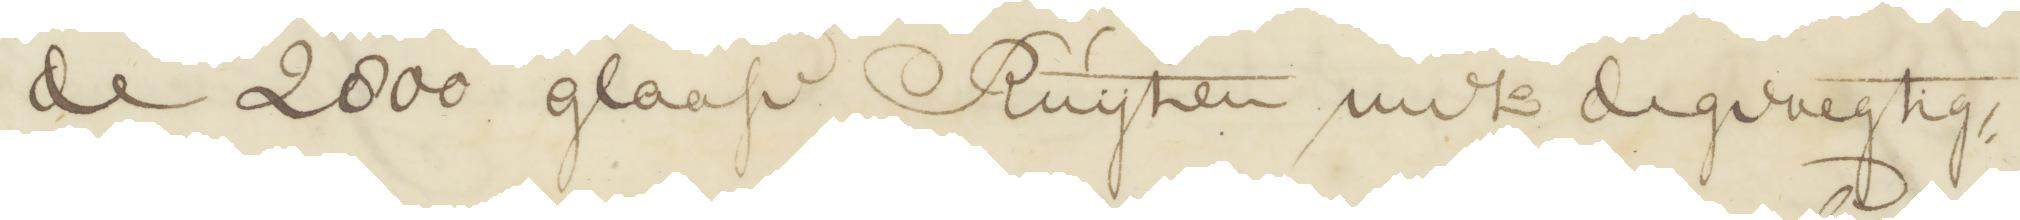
de 2800 glaase Ruijten met de geregtig„
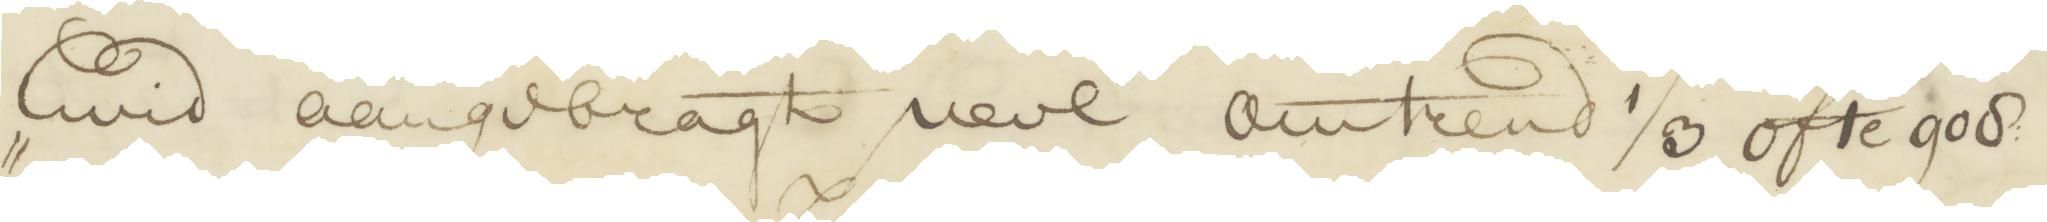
heid aangebragt veel omtrend 1/3 ofte 908:
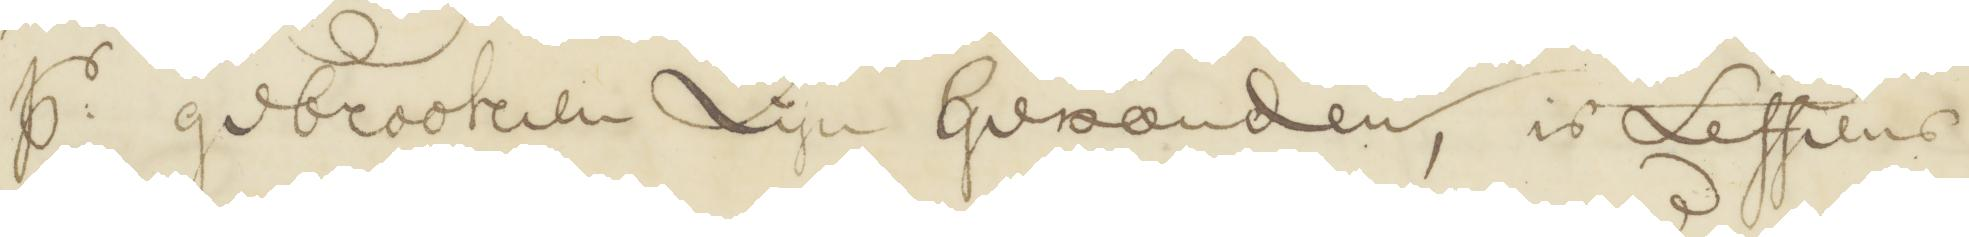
p:s gebrooken Zijn gevonden, is teffens
